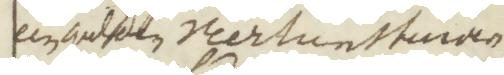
een gulden veertien stuivers
